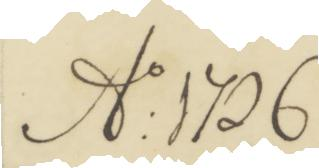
A:o 1726
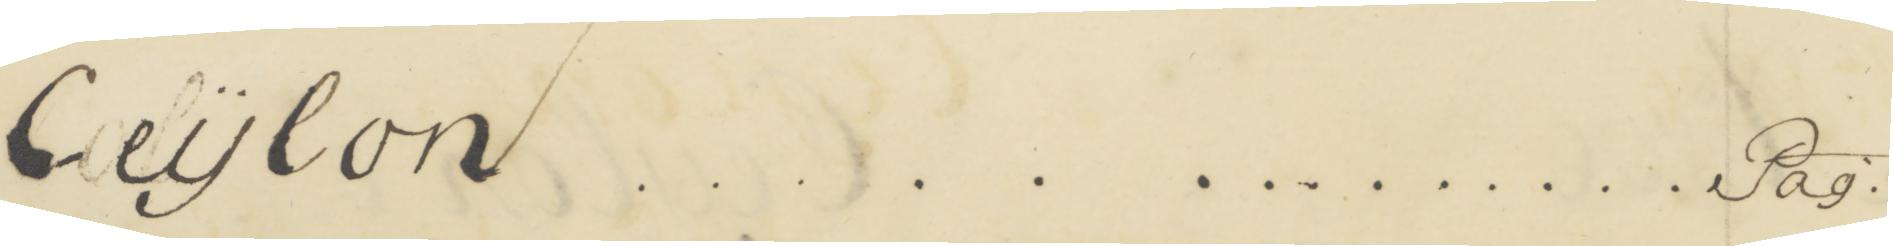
Ceijlon . . . . . . . . . . . . . . Pag:
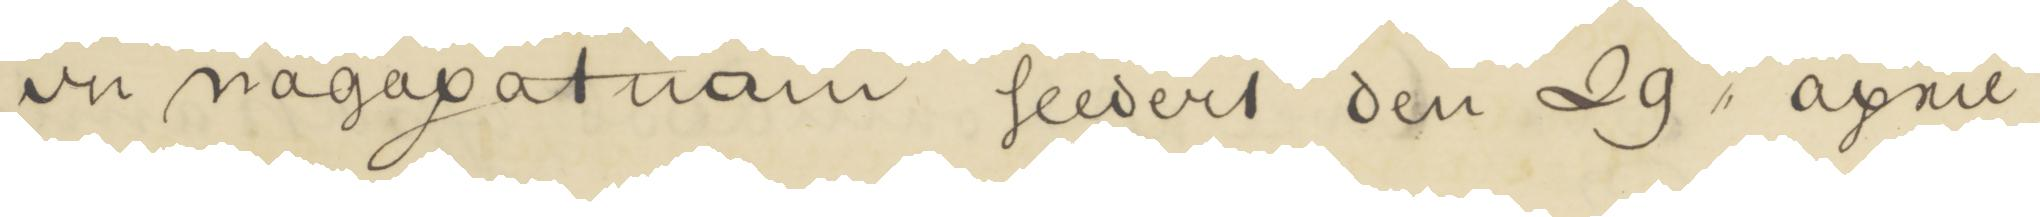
en nagapatnam seedert den 29„n april
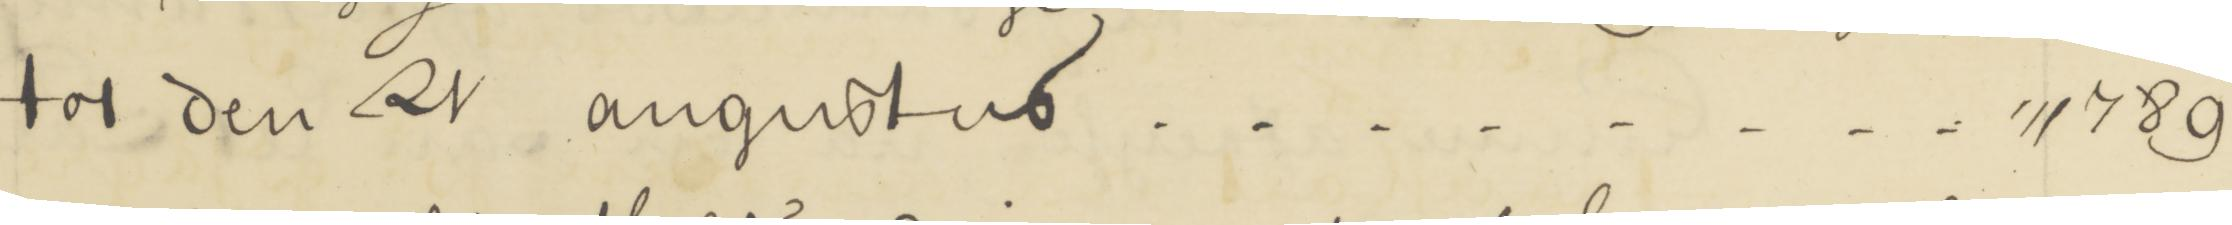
tot den 21 augustus . - - - - - - - „789
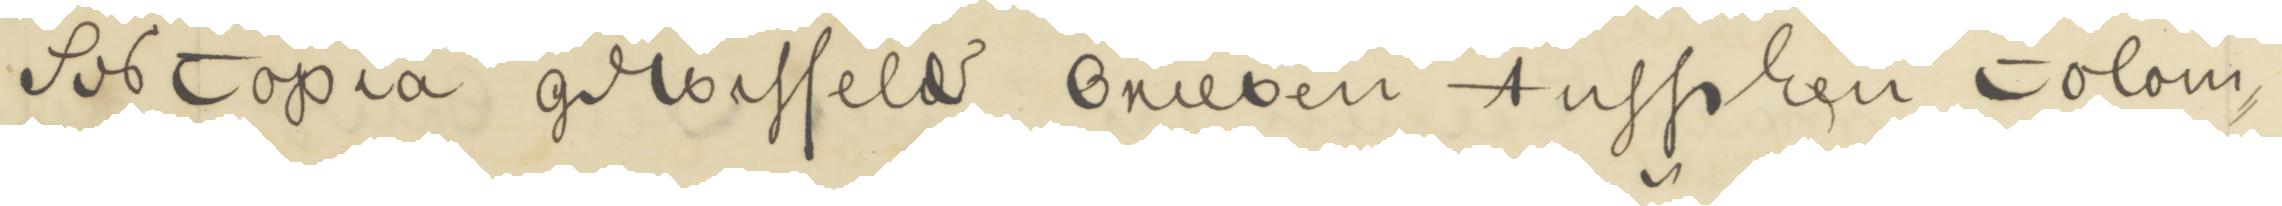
ses Copia gewisselde brieven tusschen colom„
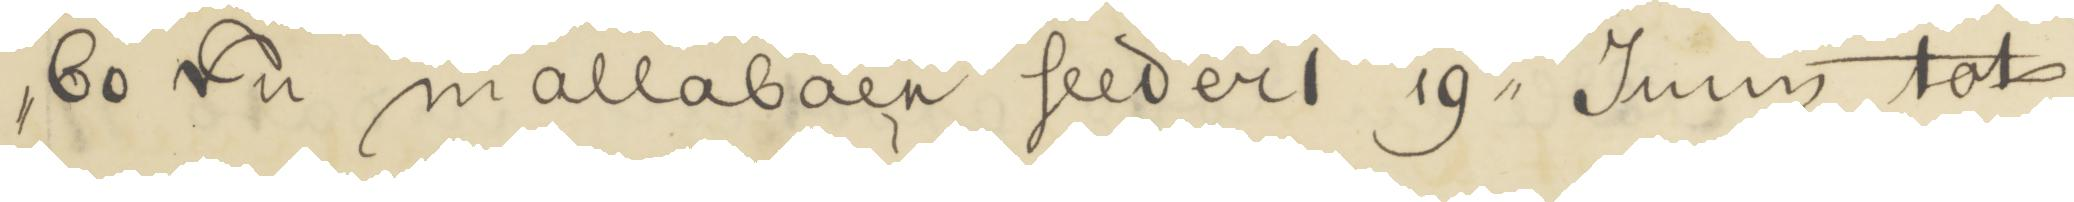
„bo En mallabaer seedert 19„n Iunij tot
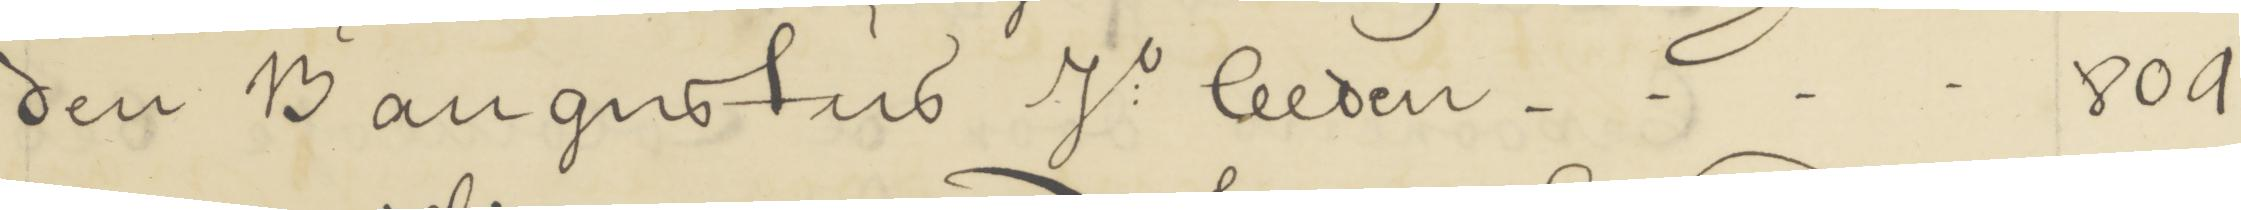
den 13 augustus J:o leeden - - - - 804
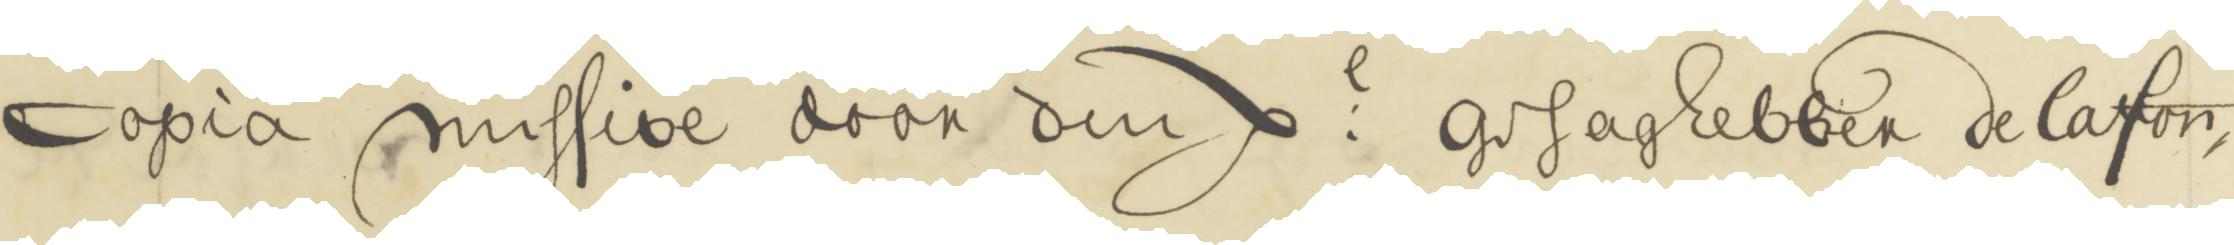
Copia missive door den p:l gesaghebber de lafon„
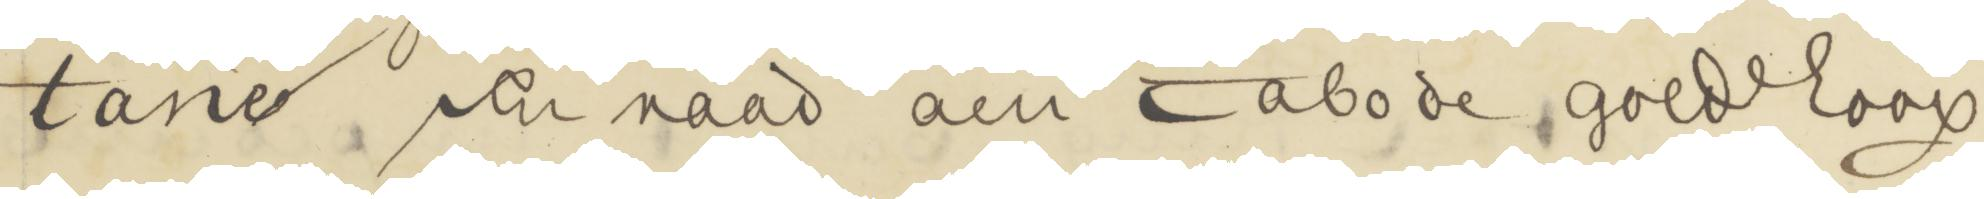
tane en raad aen Cabo de goede hoop
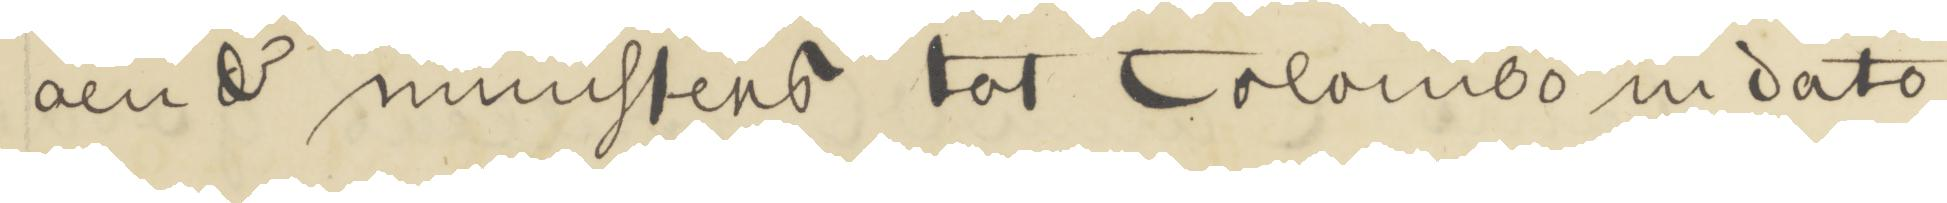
aen de ministers tot Colombo in dato
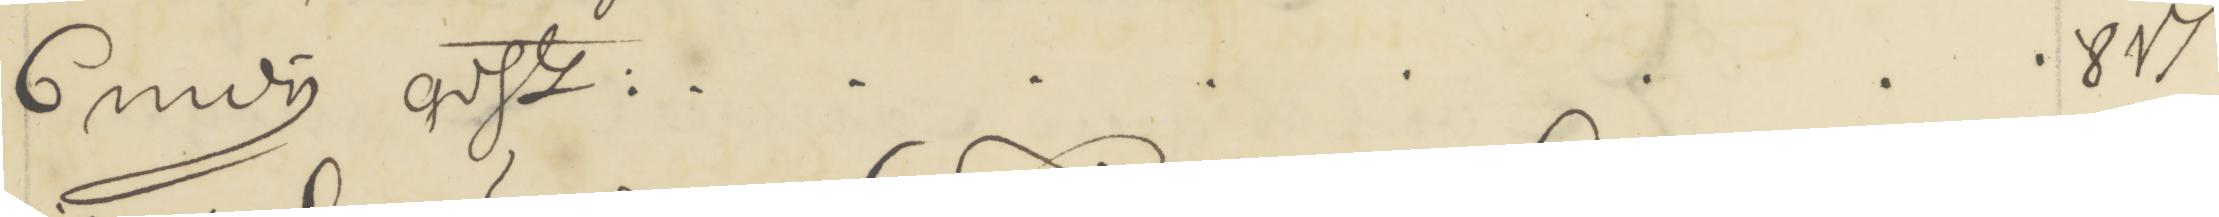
6 meij gesz: . . . . . . . . 817
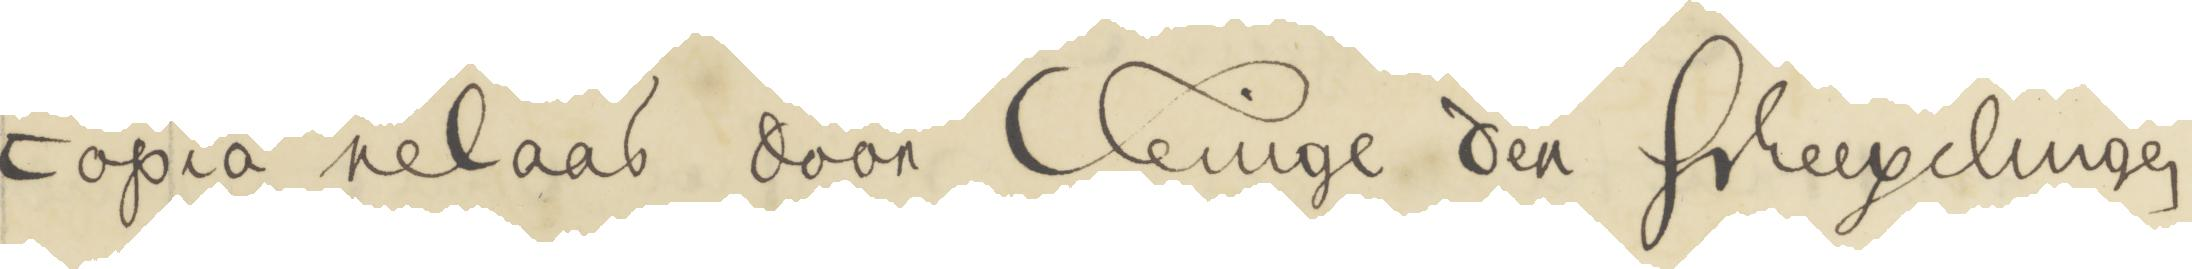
Copia relaas door Eenige der scheepelingen
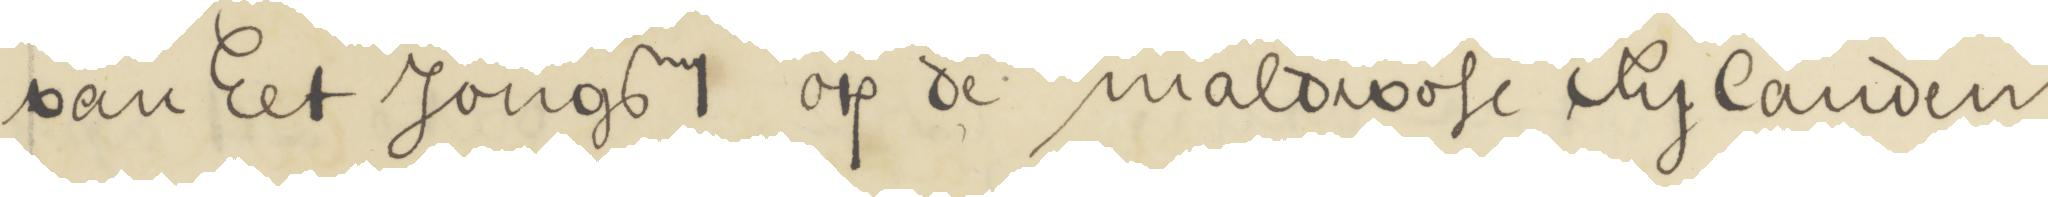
van het Jongst op de maldivose Eylanden
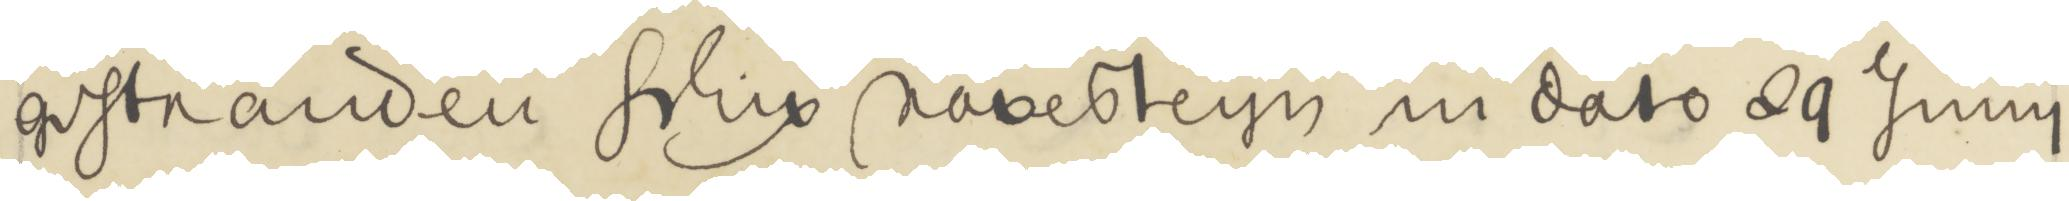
gestranden schip ravesteijn in dato 24 Junij
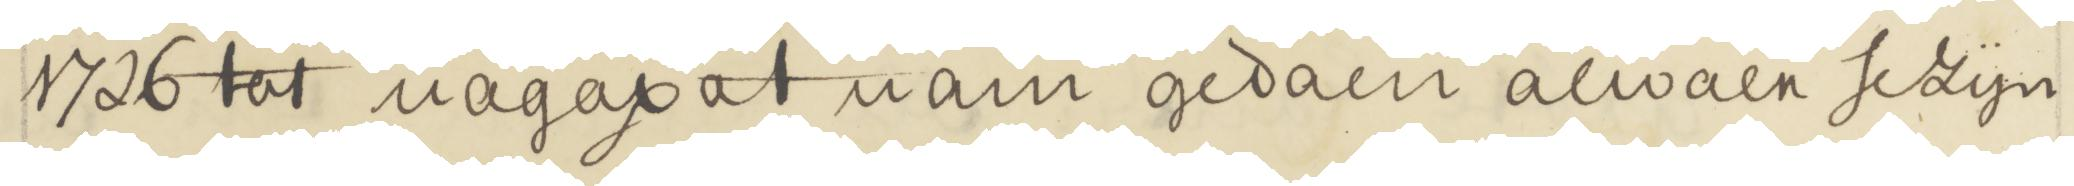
1726 tot nagapatnam gedaen alwaer se zijn
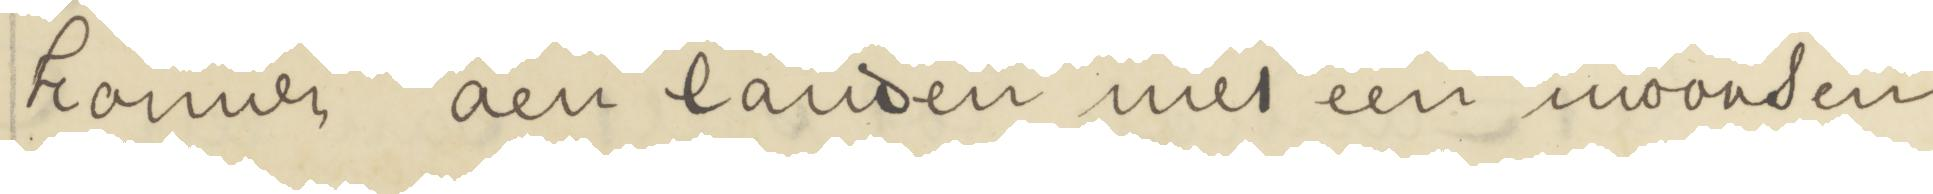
komen aen landen met een moorsen
